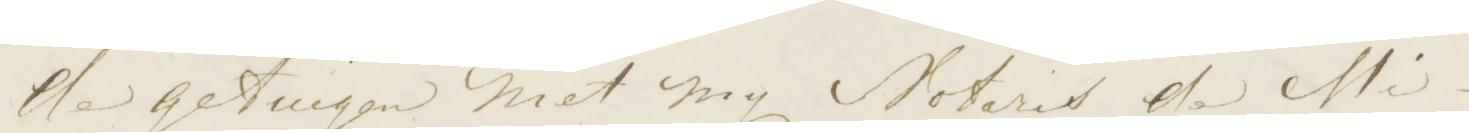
de getuigen met my Notaris de Mi-
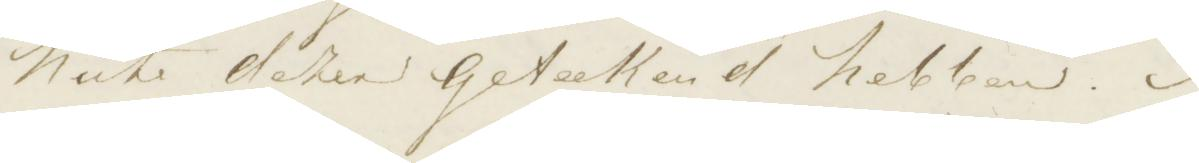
nute dezer geteekend hebben.
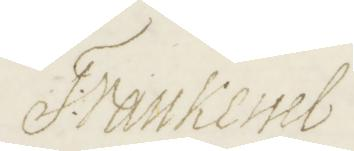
F: van Kessel
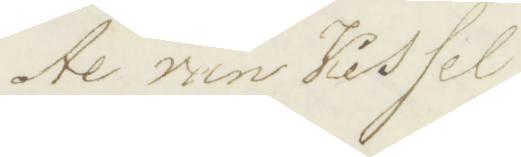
Ae van Kessel
